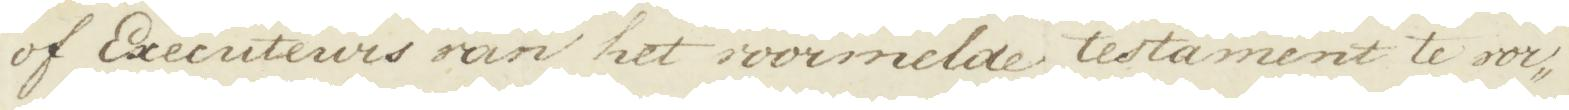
of Executeurs van het voormelde testament te vor„
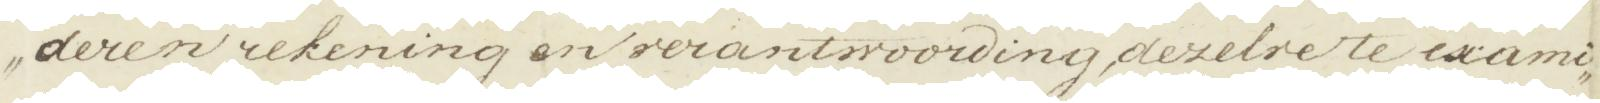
„deren rekening en verantwoording, dezelve te exami„
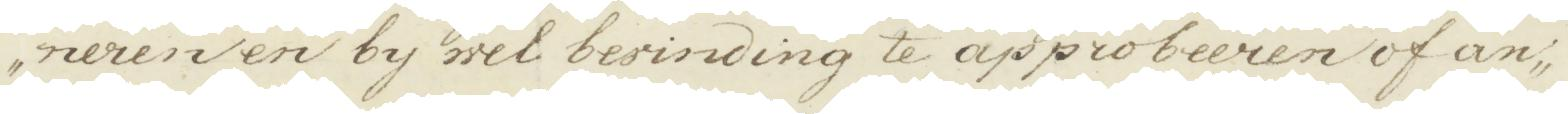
„neren en by wel bevinding te approbeeren of an„
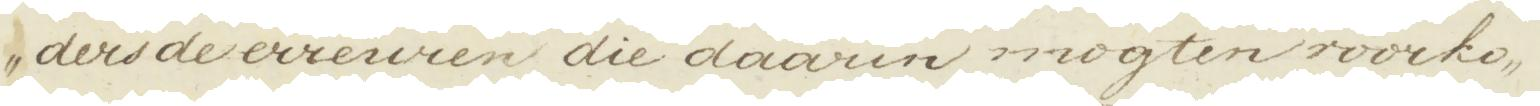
„ders de erreuren die daarin mogten voorko„
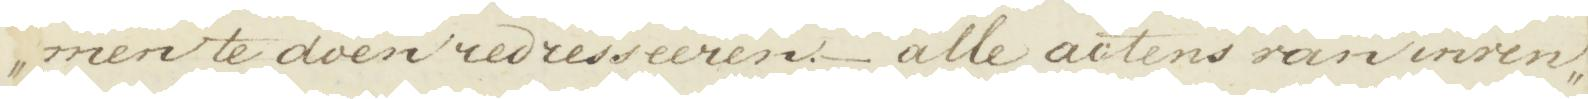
„men te doen redresseeren._ alle actens van inven„
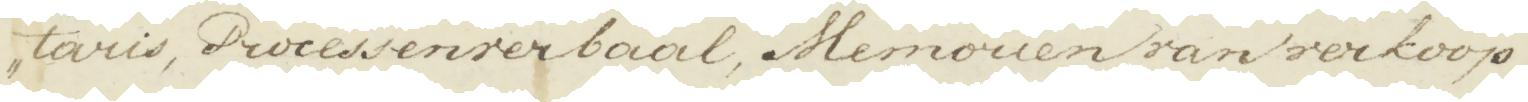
„taris, Processenverbaal, Memorien van verkoop
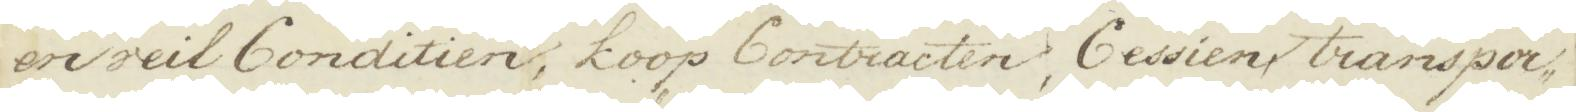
en veil Conditien, koop Contracten, Cessien, transpor„
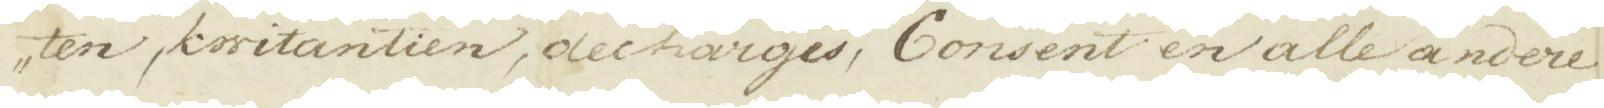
„ten, kwitantien, decharges, Consent en alle andere
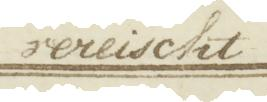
vereischt
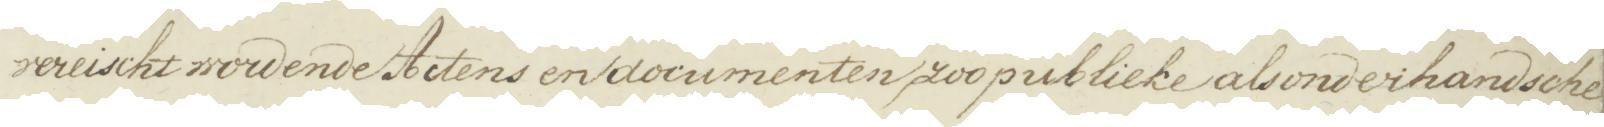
vereischt wordende Actens en documenten, zoo publieke als onderhandsche
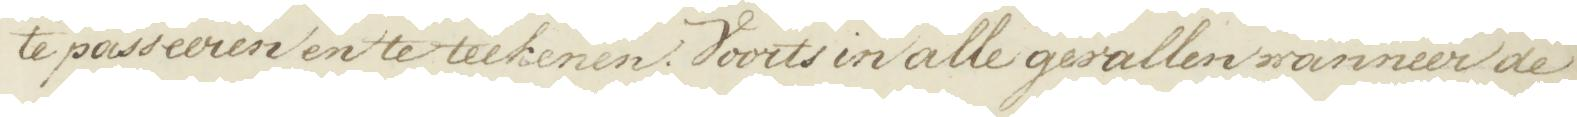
te passeeren en te teekenen. Voorts in alle gevallen wanneer de
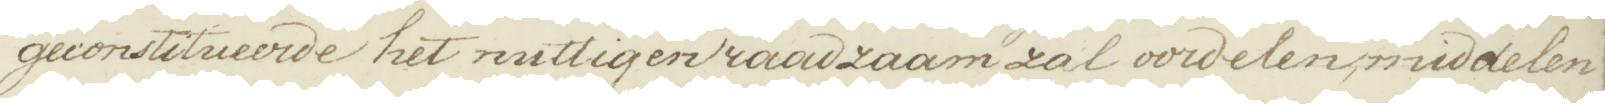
geconstitueerde het nuttig en raadzaam zal oordelen, middelen
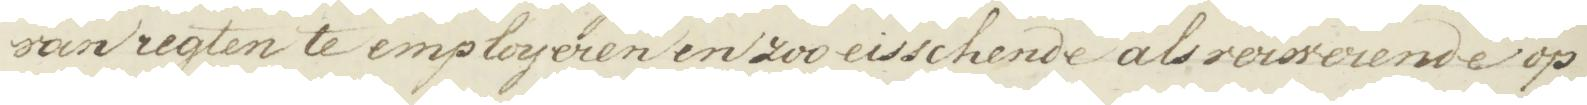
van regten te employeren en zoo eisschende als verwerende op
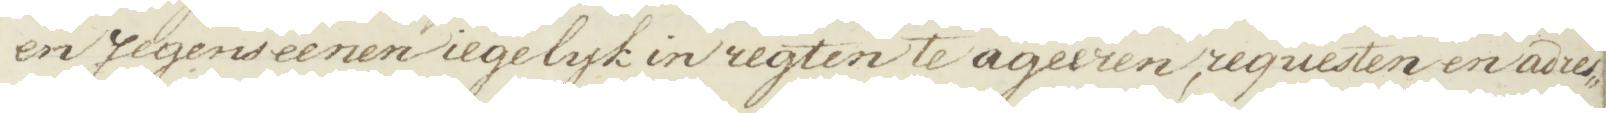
en jegens eenen iegelyk in regten te ageeren, requesten en adres„
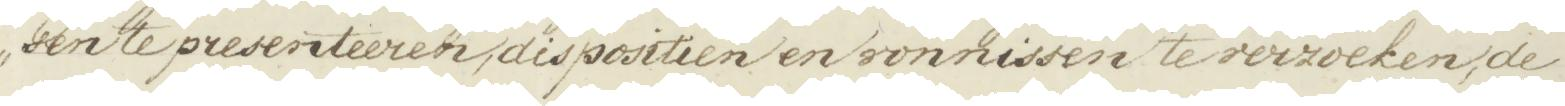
„sen te presenteeren, dispositien en vonnissen te verzoeken, de
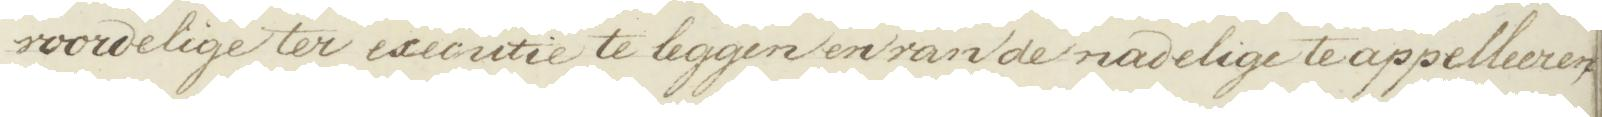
voordelige ter executie te leggen en van de nadelige te appelleeren
